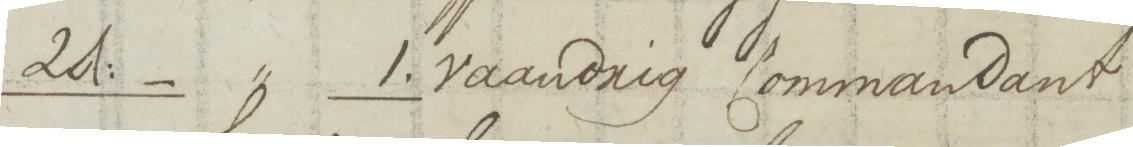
24: — „ 1. vaandrig Commandant
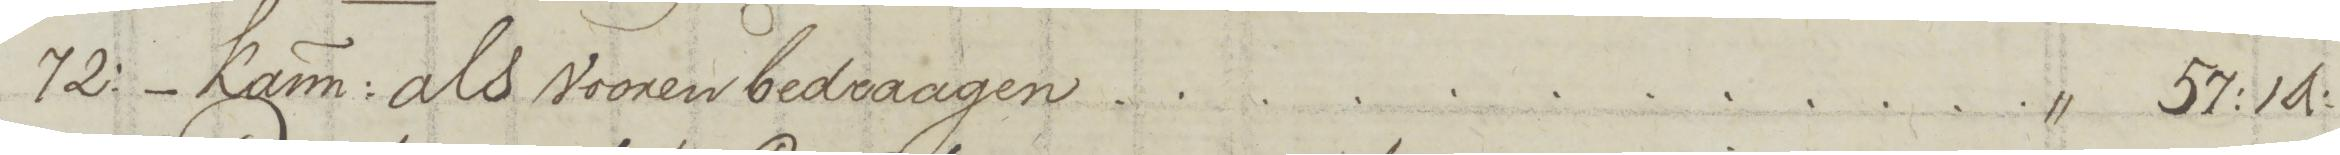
72: — kann: als vooren bedraagen - - - - - - - - - - - - „ 57: 14
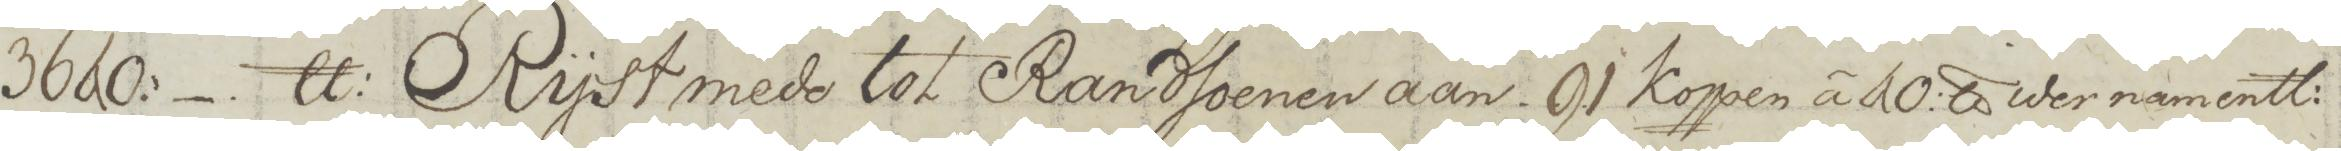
3640: —. lb: Rijst mede tot Randsoenen aan. 91 koppen â 40: lb ider namentl:
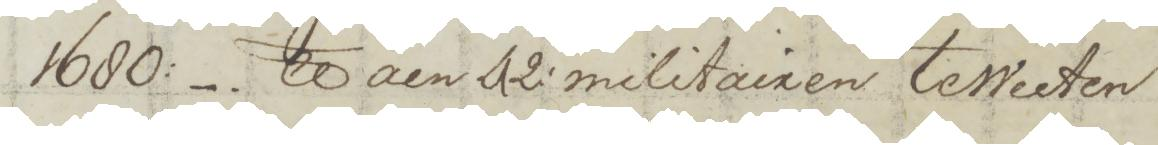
1680: —. lb aen 42: militairen te weeten
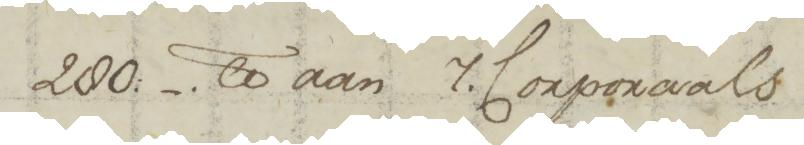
280: —. lb aan 7. Corporaals
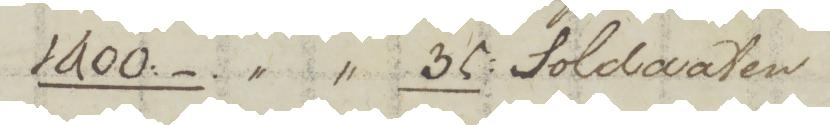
1400: —. „ „ 35: soldaaten
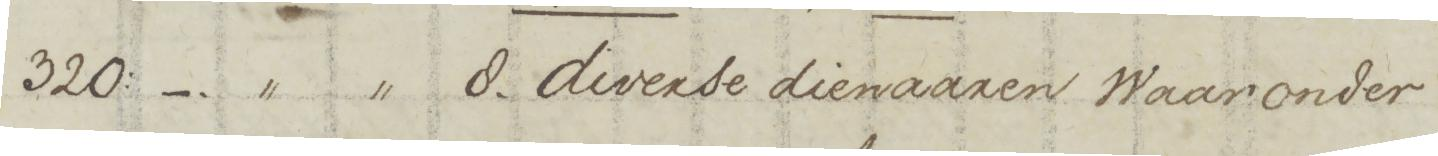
320: —. „ „ 8. diverse dienaaren Waar onder
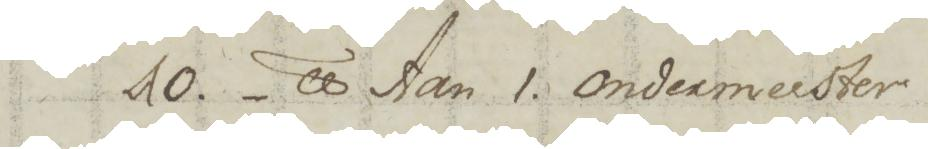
40. — lb Aan 1. ondermeester
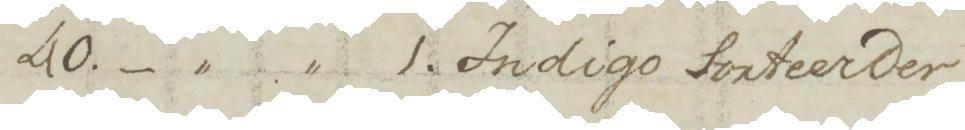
40. — „ „ 1. Indigo sorteerder
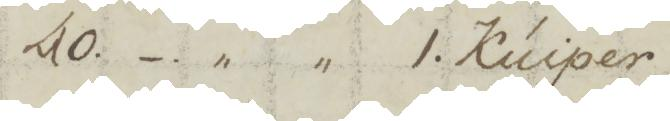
40. —. „ „ 1. Kuiper
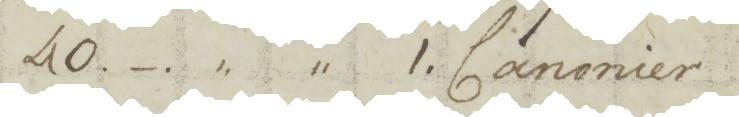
40. —. „ „ 1. Canonier
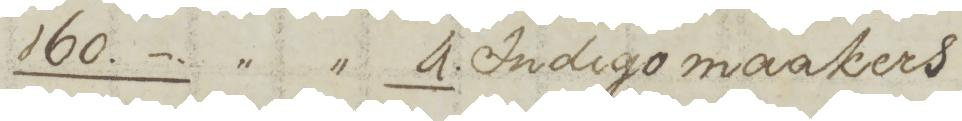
160. —. „ „ 4. Indigo maakers
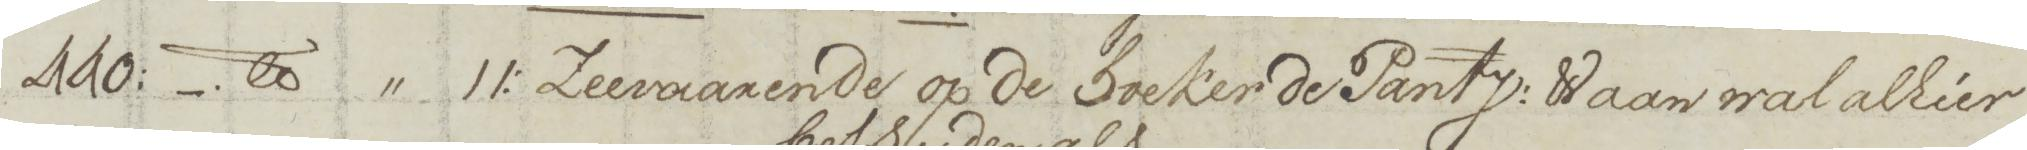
440: —. lb „ 11: Zeevaarende op de hoeker de Panty: & aan wal alhier
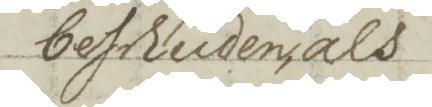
bescheiden, als
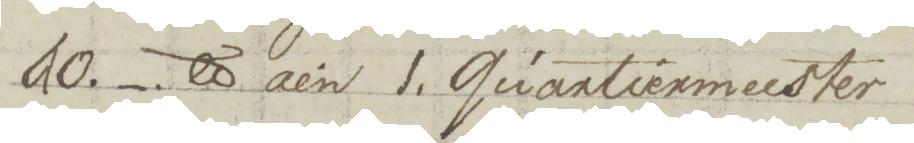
40. —. lb aen 1. Quartiermeester
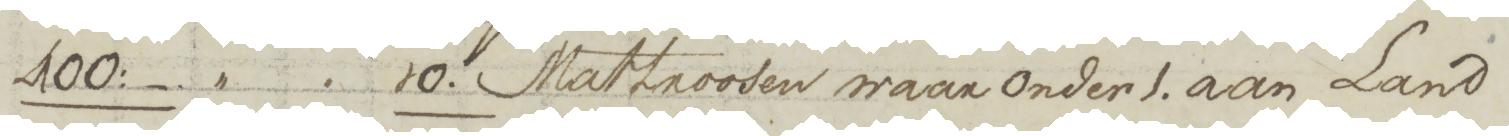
400: —. „ „ 10. Mattroosen waar onder 1. aan Land
